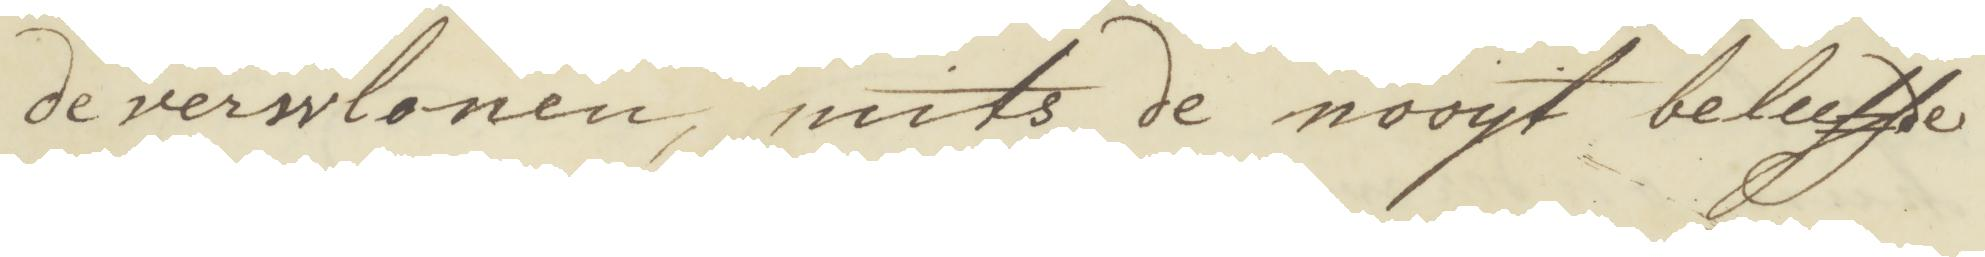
de verwlonen, mits de nooyt beleeffde
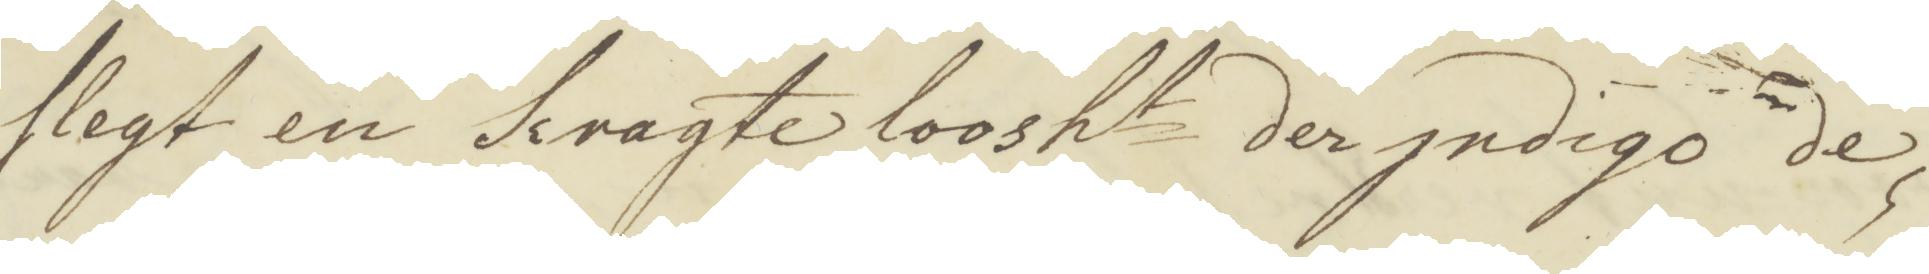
slegt en kragte loosh=t der jndigo de„
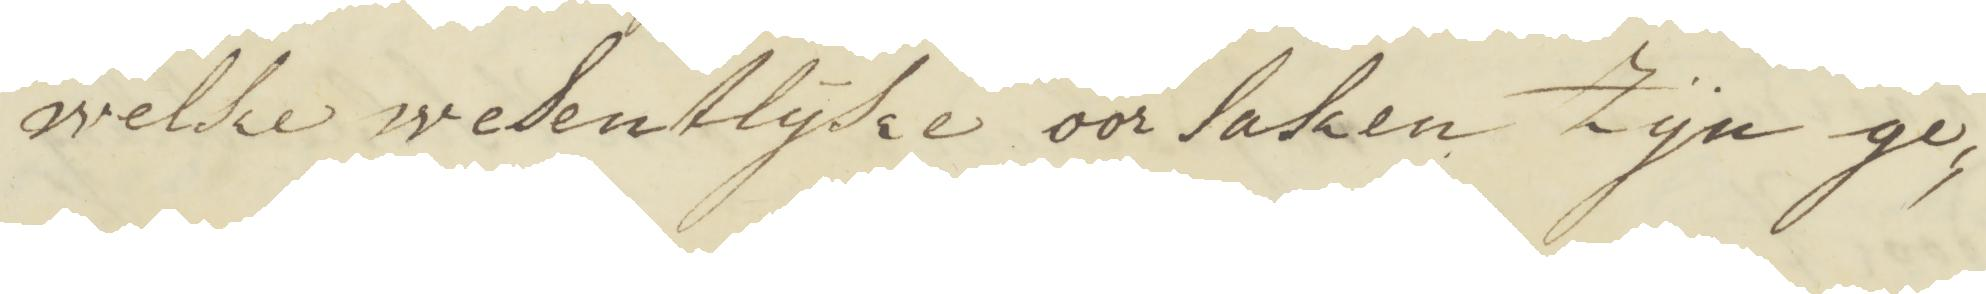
welke wesentlijke oorsaken zijn ge„
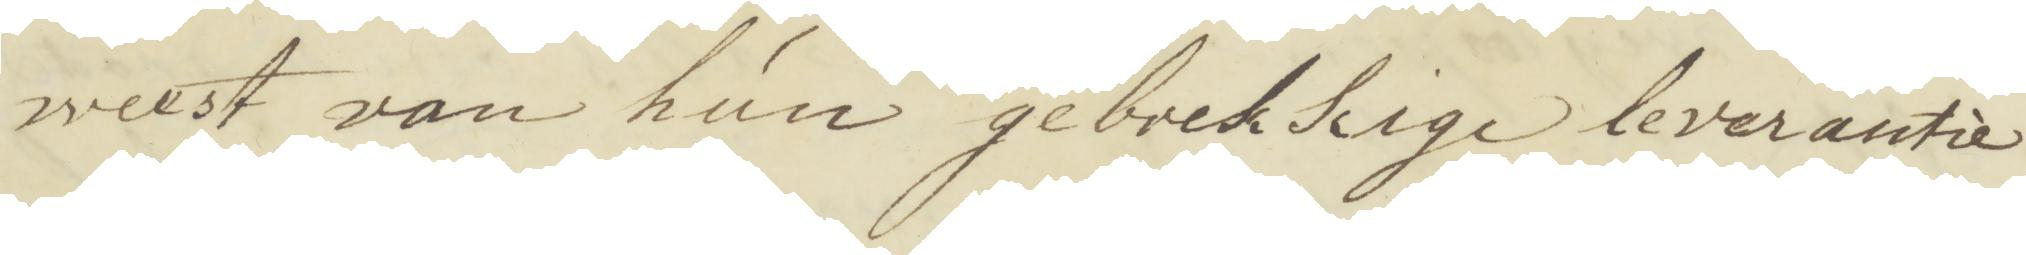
weest van hun gebrekkige leverantie
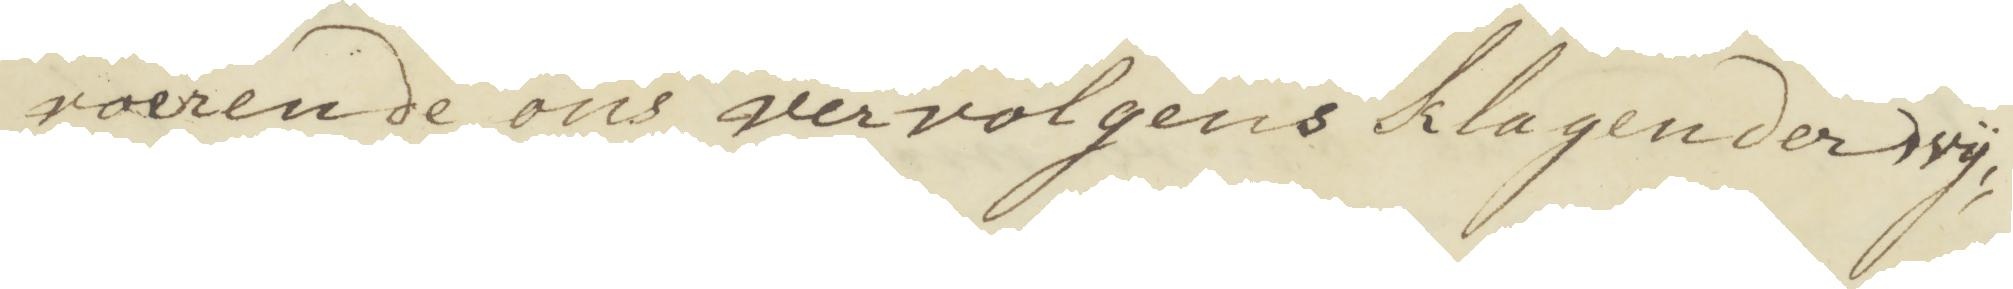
voeren de ons vervolgens klagen der wij„
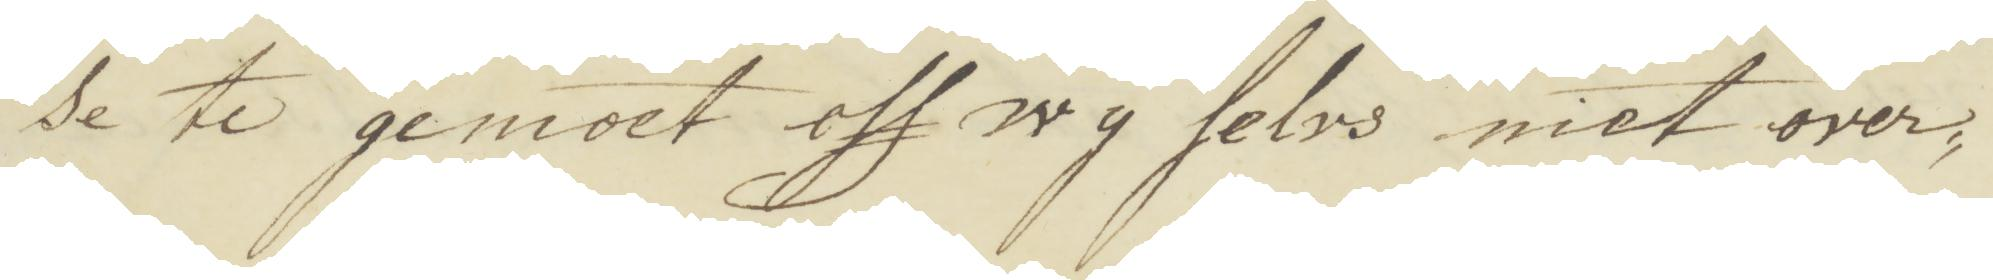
se te gemoet off wij selvs niet over„
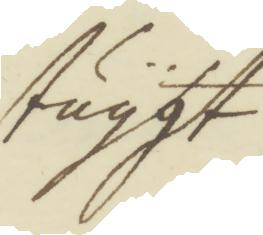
tuijgt
